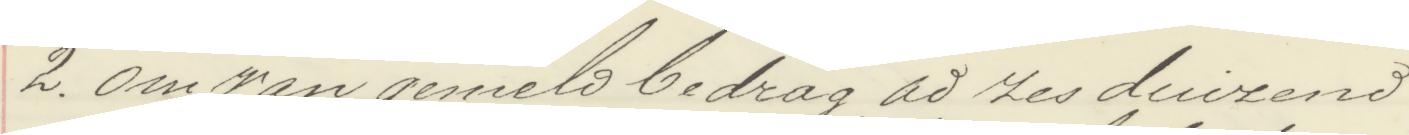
2. om van gemeld bedrag ad zes duizend
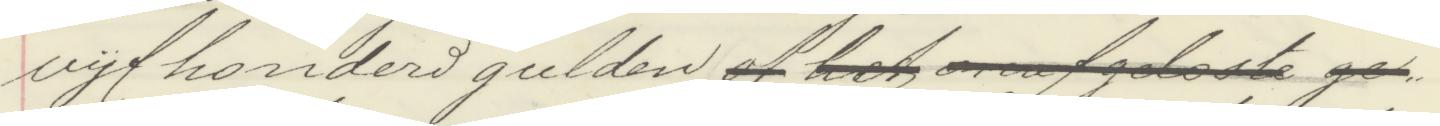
vijf honderd gulden of het onafgeloste ge-
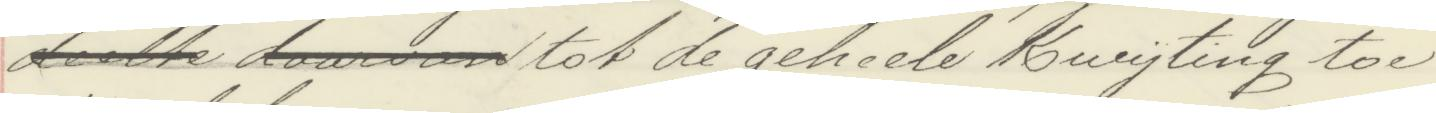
deelte daarvan tot de geheele kwijting toe
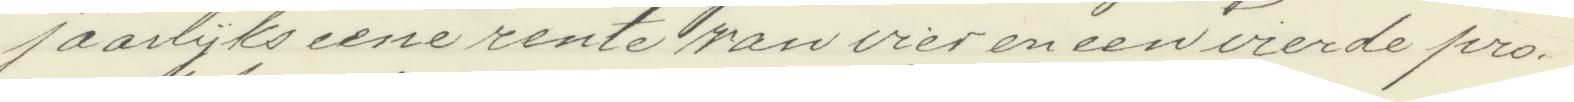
Jaarlijks eene rente van vier en een vierde pro.
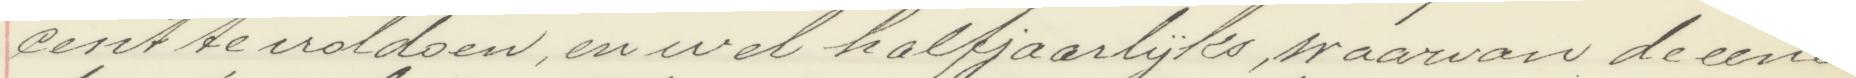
cent te voldoen, en wel halfjaarlijks, waarvan de eene
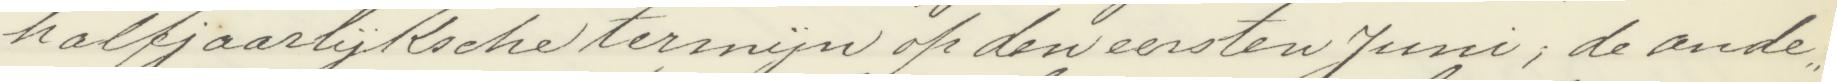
halfjaarlijksche termijn op den eersten Juni; de ande„
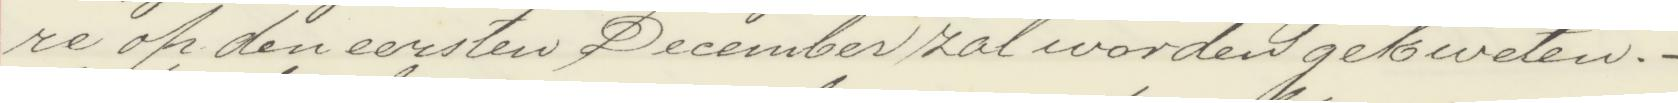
re op den eersten December zal worden gekweten.-
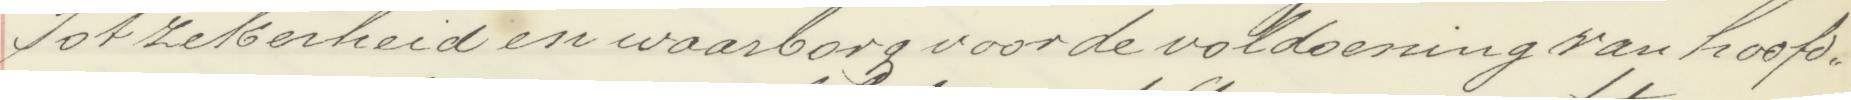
Tot zekerheid en waarborg voor de voldoening van hoofd„
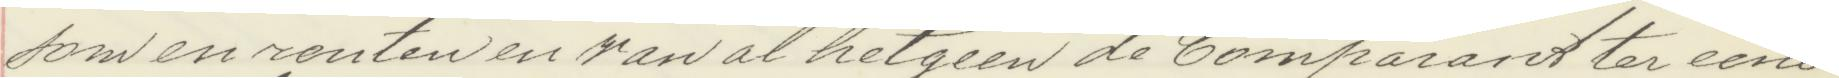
som en renten en van al hetgeen de Comparant ter eene
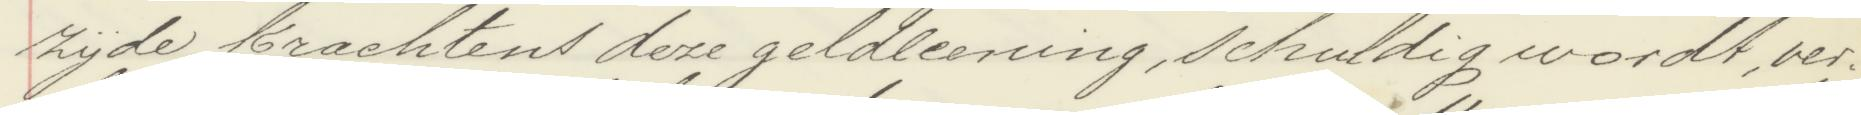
zijde, krachtens deze geldleening, schuldig wordt, ver„
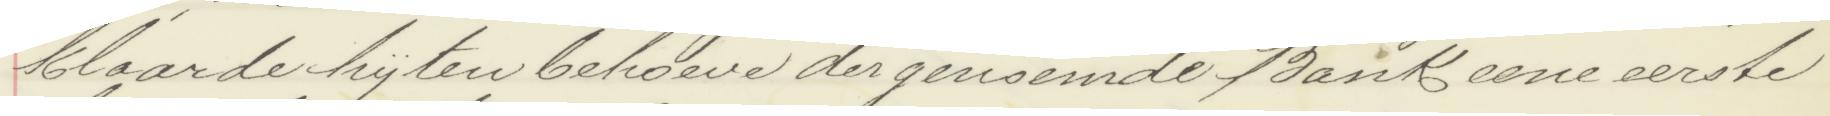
klaarde hij ten behoeve der genoemde Bank eene eerste
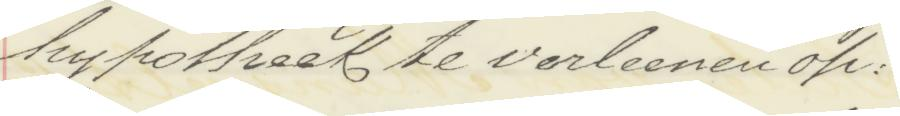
hypotheek te verleenen op:
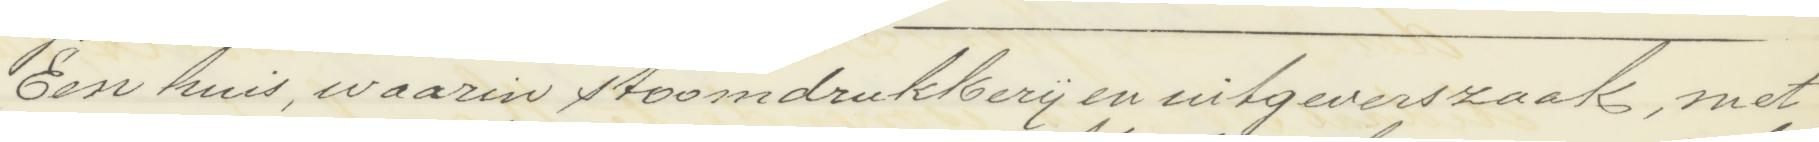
Een huis, waarin stoomdrukkerij en uitgeverszaak, met
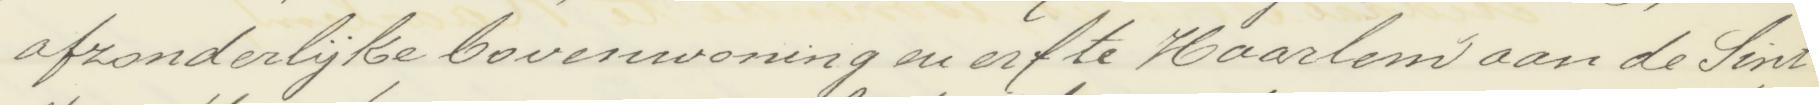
afzonderlijke bovenwoning en erf te Haarlem aan de Sint
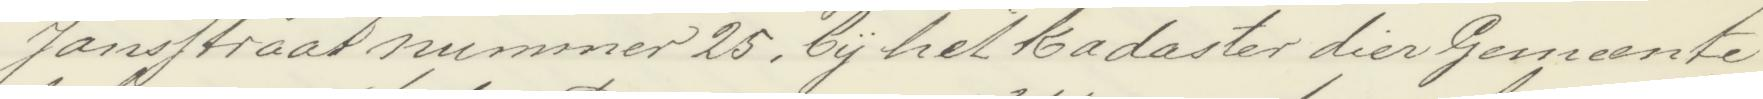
Jansstraat nummer 25, bij het kadaster dier Gemeente
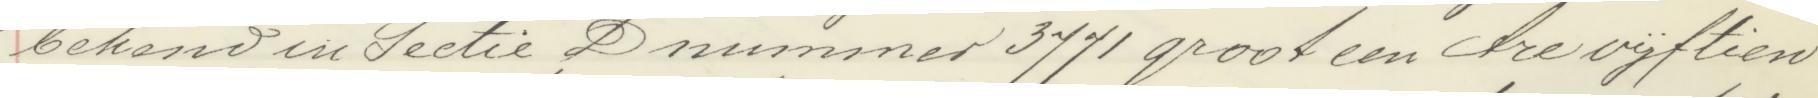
bekend in sectie D nummer 3771 groot een Are vijftien
